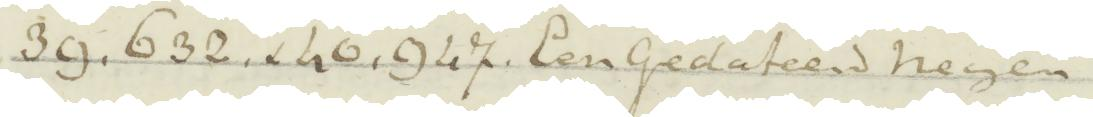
39,632, 40,947. Een Gedateerd Negen
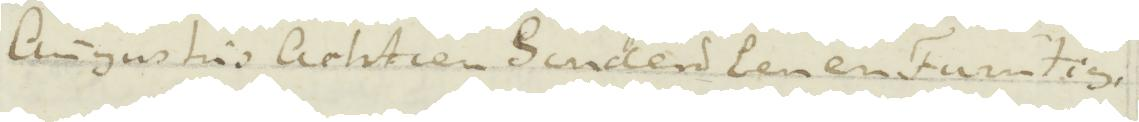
Augustus Achtien honderd Een en Twintig,
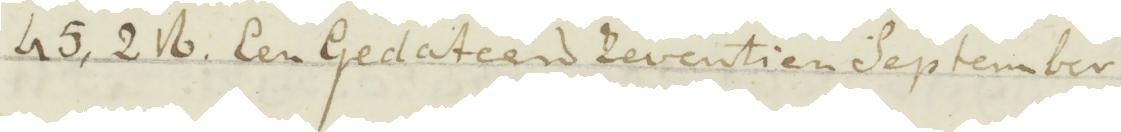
45,216. Een Gedateerd Zeventien September
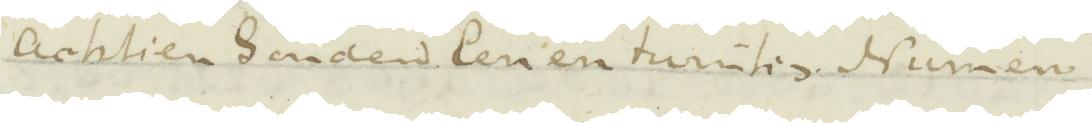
Achtien honderd Een en twintig, Numero
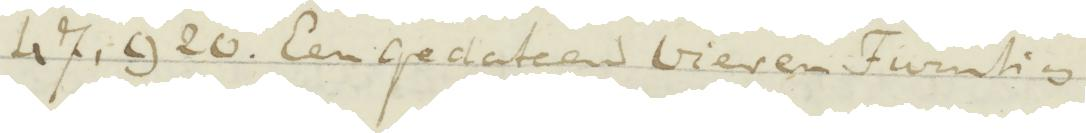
47,920. Een Gedateerd Vier en Twintig
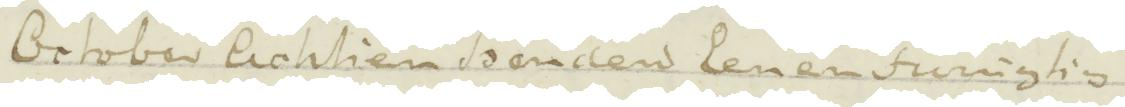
October Achtien Honderd Een en Twintig
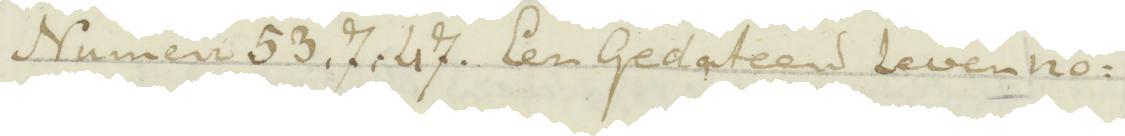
Numero 53,747. Een Gedateerd zeven no„
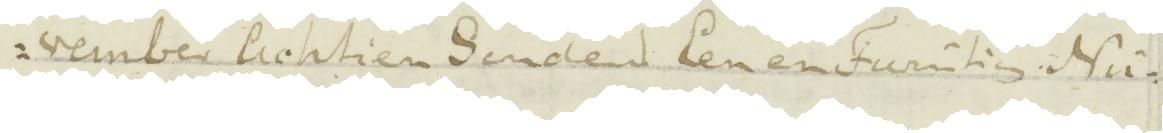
„vember Achtien honderd Een en Twintig Nu„
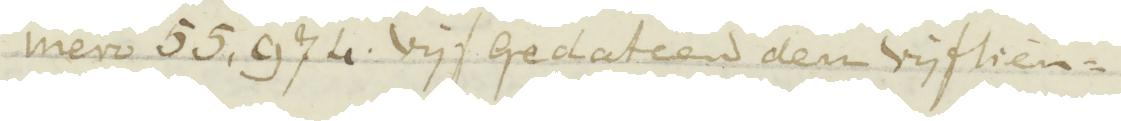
mero 55,974. Vijf Gedateerd den Vijftien„
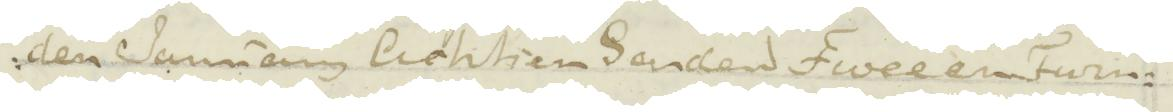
„den Ianuarij Achtien honderd Twee en Twin„
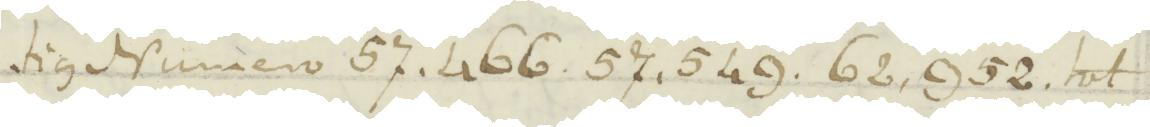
„tig Numero 57,466, 57,549, 62,952, tot
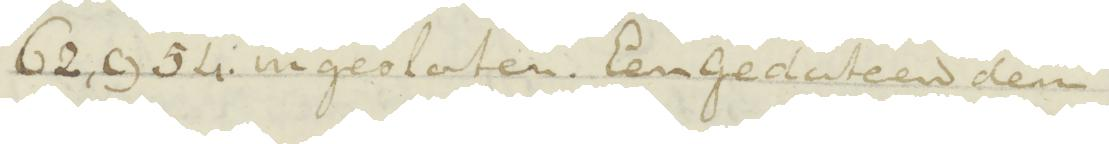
62,954: ingesloten. Een gedateerd den
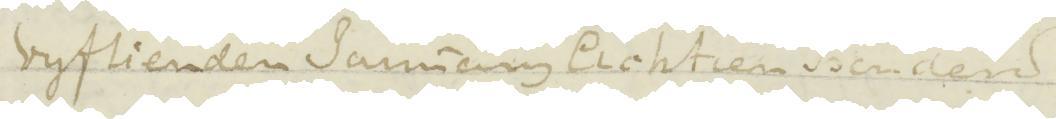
vyftienden Ianuarij Achtien Honderd
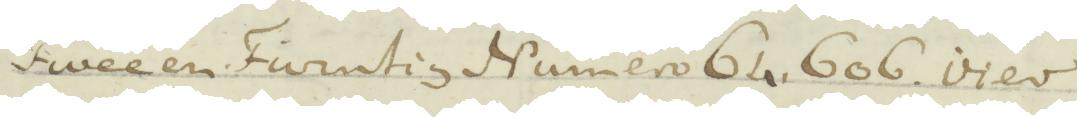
Twee en Twintig Numero 64,606. Vier
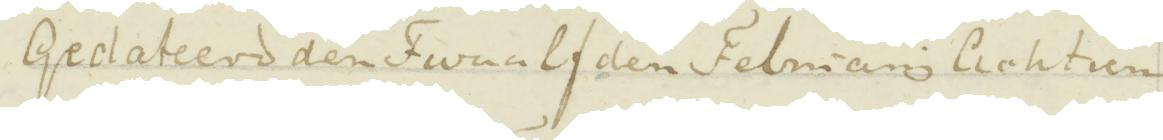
Gedateerd den Twaalfden Februarij Achtien
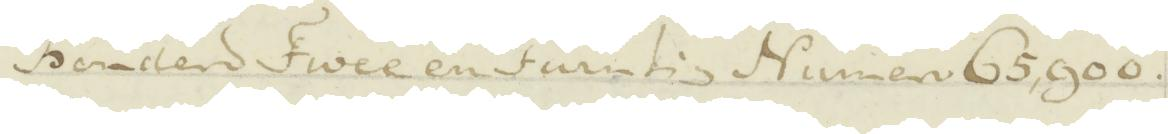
Honderd Twee en Twintig Numero 65,900,
